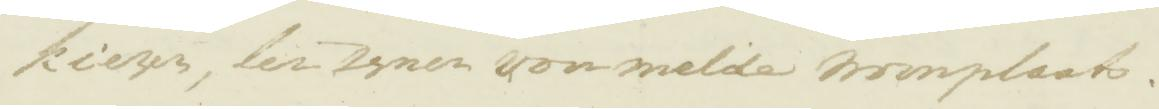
kiezen, ter zynen voormelde woonplaats.
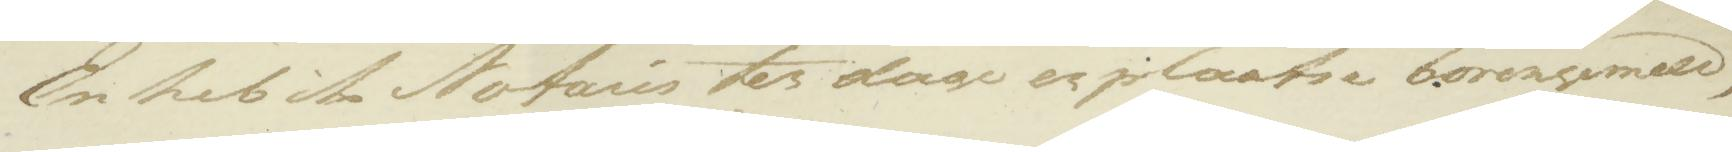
En heb ik Notaris ten dage en plaatse bovengemeld,
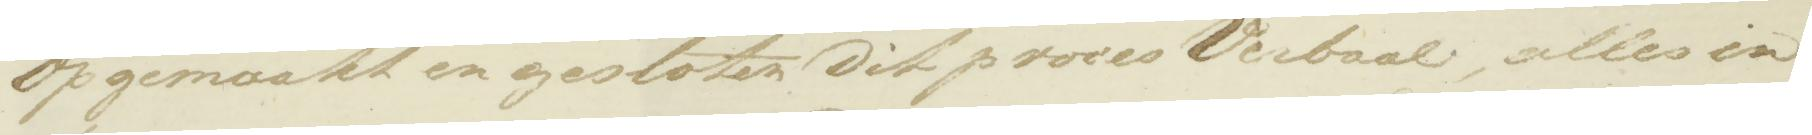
opgemaakt en gesloten dit proces Verbaal, alles in
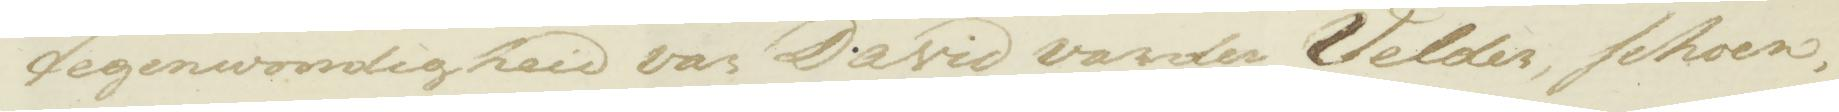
tegenwoordigheid van David vander Velden, schoen,
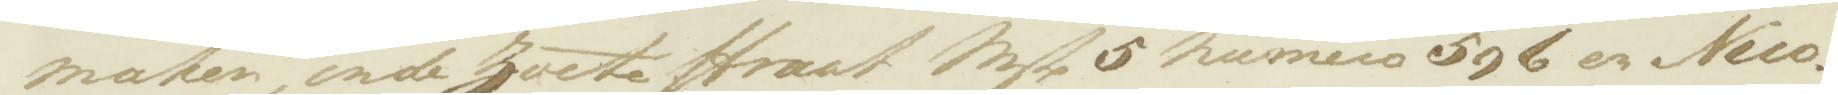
maker, in de Zoete straat Wyk 5 numero 596 en Nico.
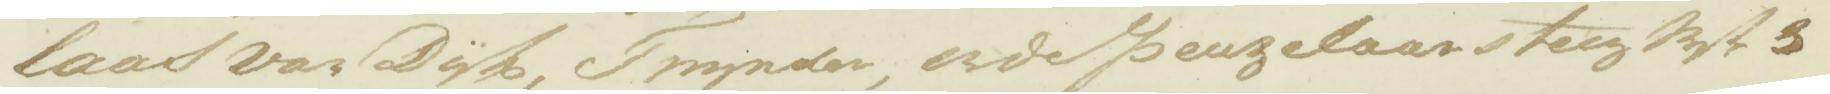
laas van Dijk, Twijnder, in de Beuzelaarsteeg Wyk 3
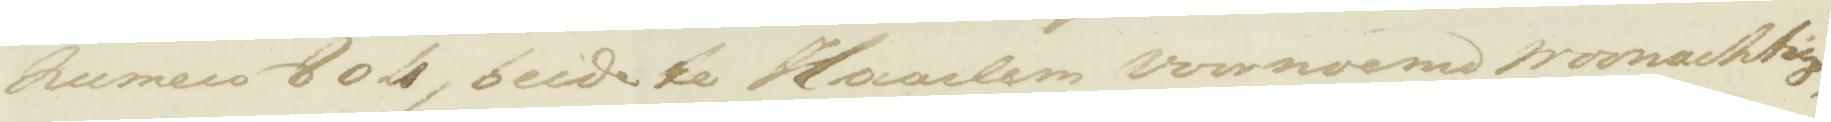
numero 804, beide te Haarlem voornoemd woonachtig,
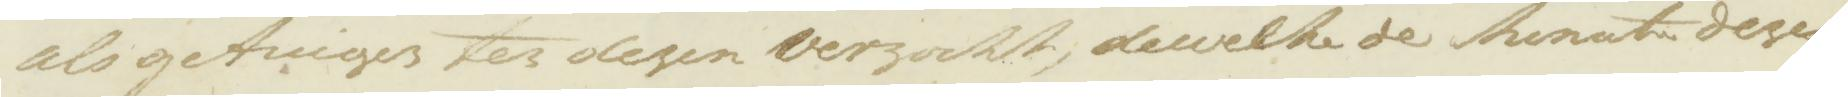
als getuigen ter dezen verzocht, dewelke de Minute dezes,
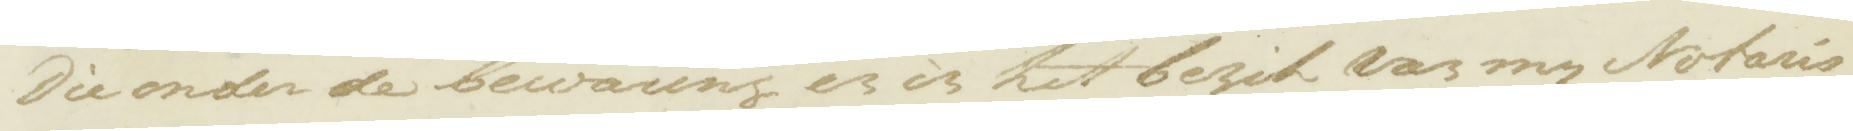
die onder de bewaring en in het bezit van my Notaris
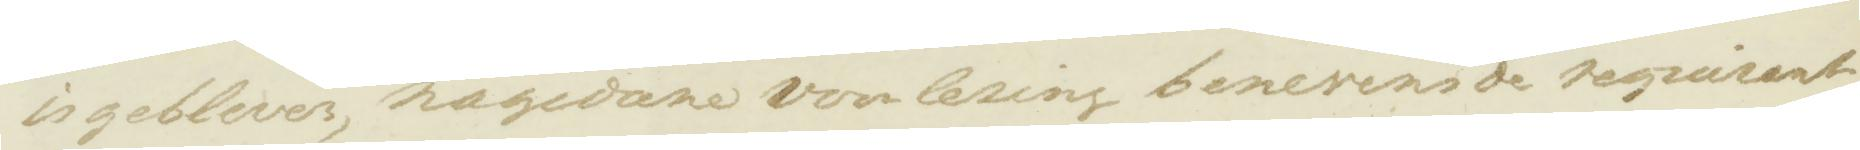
is gebleven, na gedane voorlezing benevens de requirant
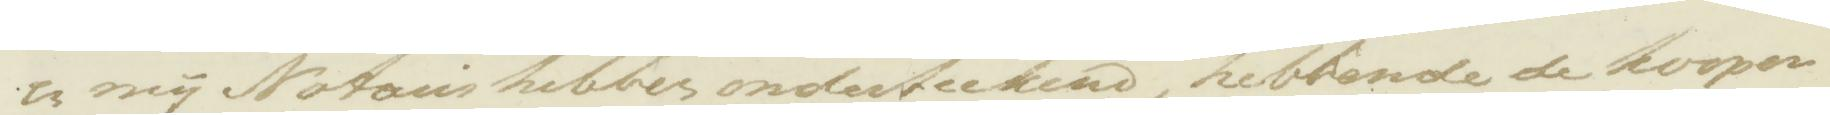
en mij Notaris hebben onderteekend, hebbende de kooper
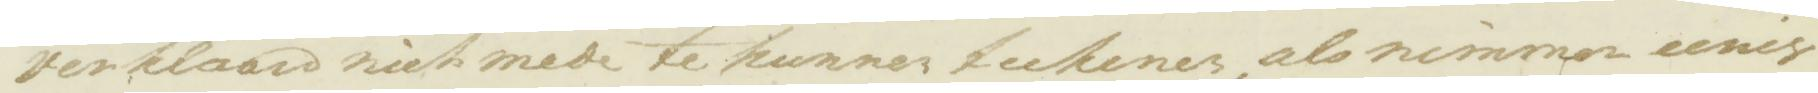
verklaard niet mede te kunnen teekenen, als nimmer eenig
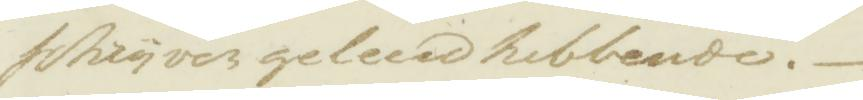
schrijven geleerd hebbende.—
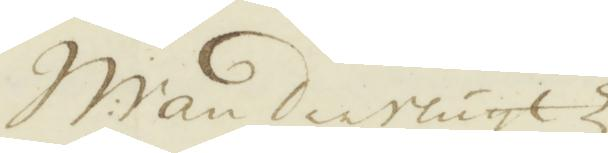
W:van der Vlugt
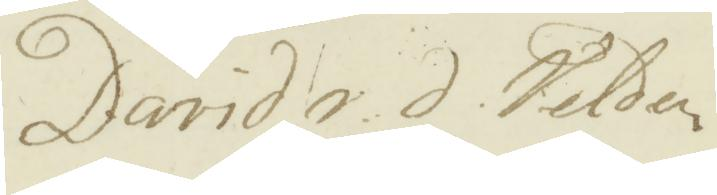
David v: d. Velden
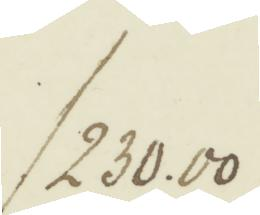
ƒ230.00
